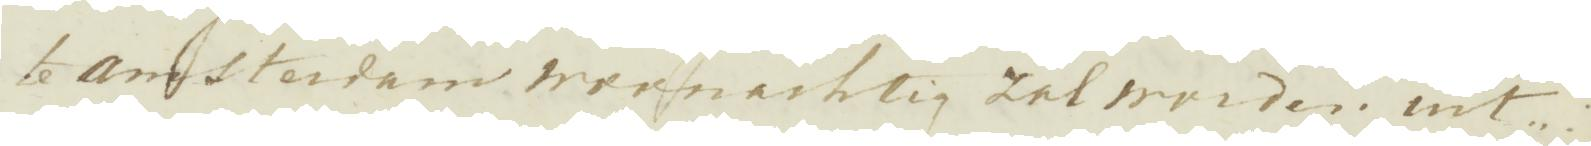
te amsterdam woonachtig zal worden uit„
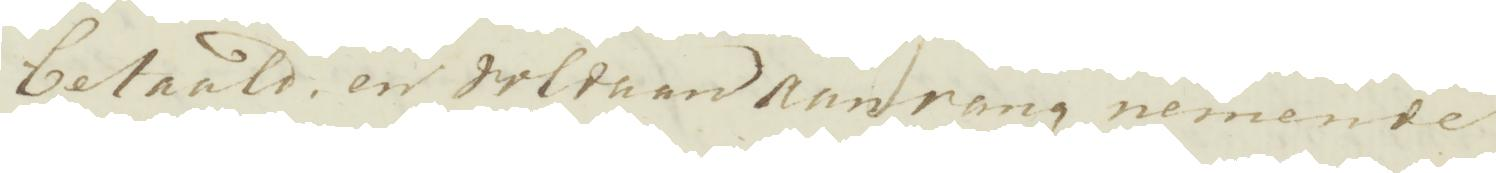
betaald, en voldaan aanvang nemende
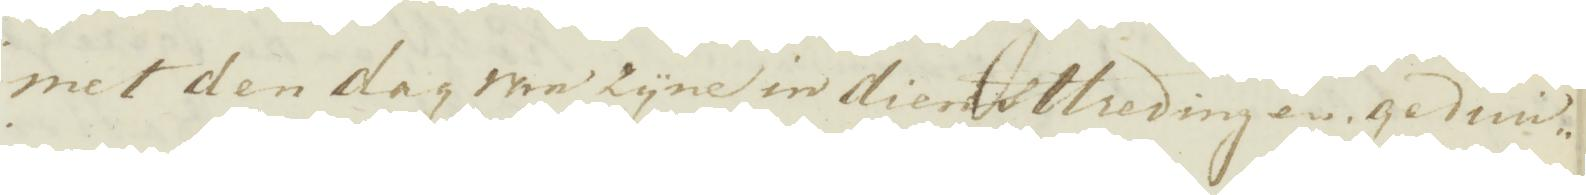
met den dag van zijne in diensttreding en, geduu„
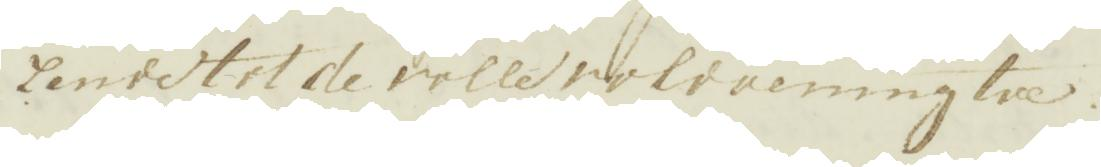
rende tot de volle voldoening toe.
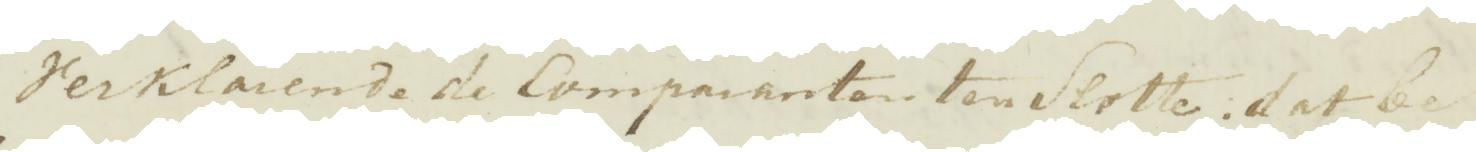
Verklarende de Comparanten ten slotte: dat be
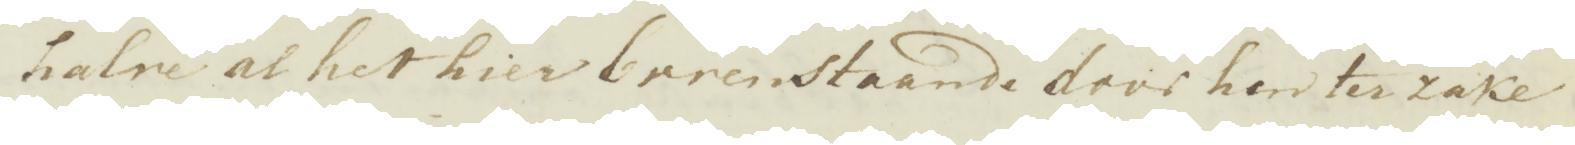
halve al het hier bovenstaande door hen ter zake
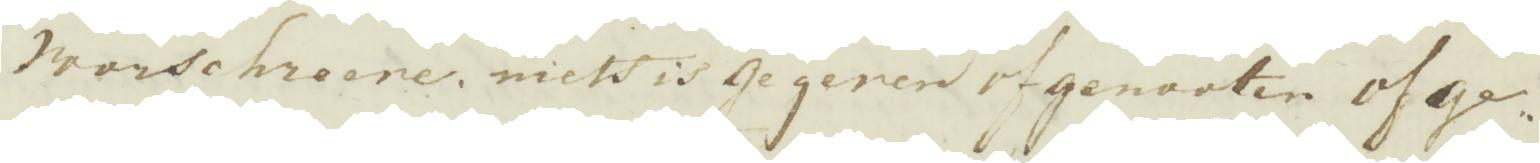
voorschreeve, niets is gegeven of genooten of ge„
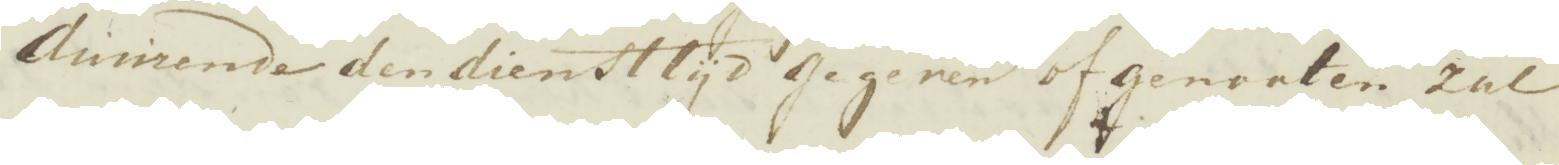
duurende den diensttijd gegeven of genooten zal
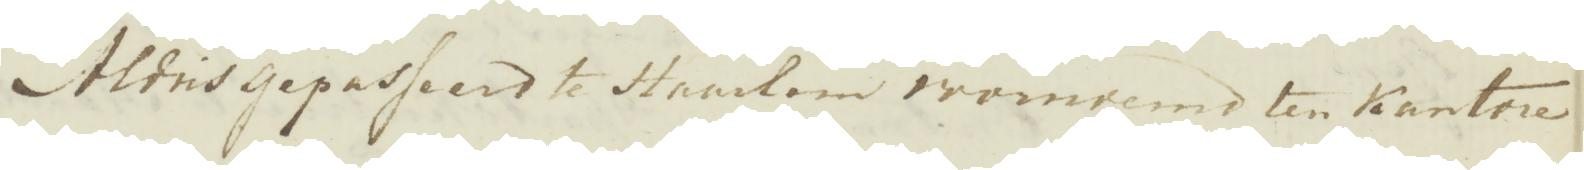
Aldus gepasseerd te Haarlem voornoemd ten kantore
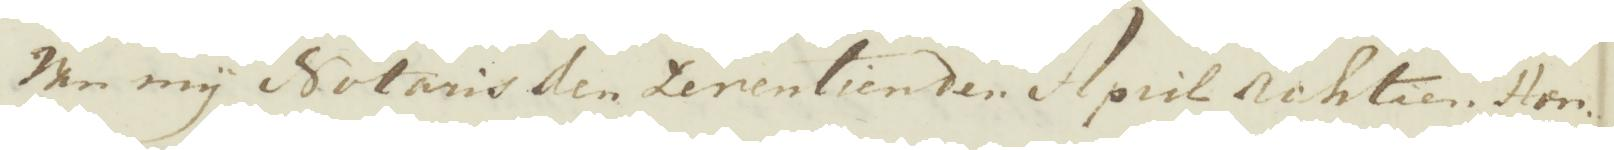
Van mij Notaris den Zeventienden April achtien Hon
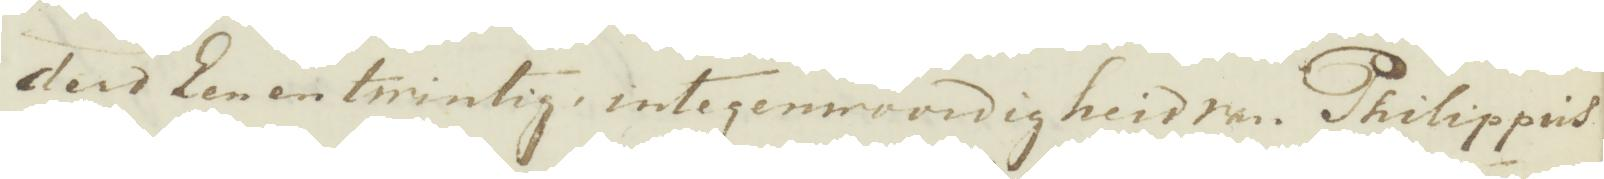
derd Een en twintig, integenwoordigheid van Philippus
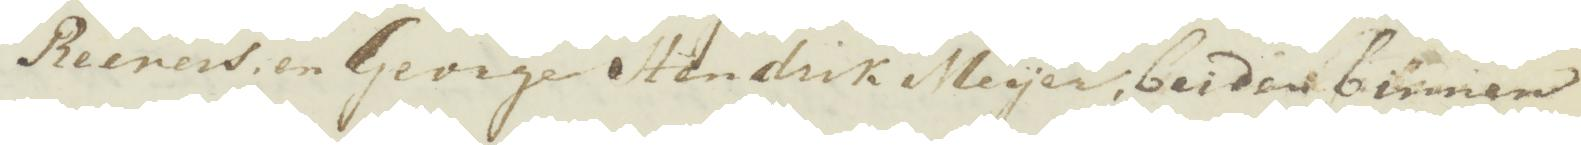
Reevers, en George Hendrik Meijer, beiden binnen
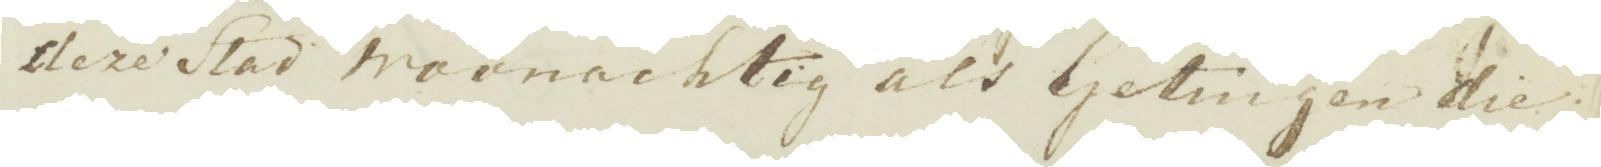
deze stad woonachtig als Getuigen die
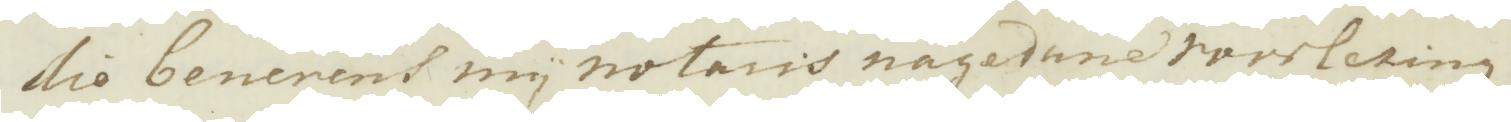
die benevens mij notaris nagedane voorlezing
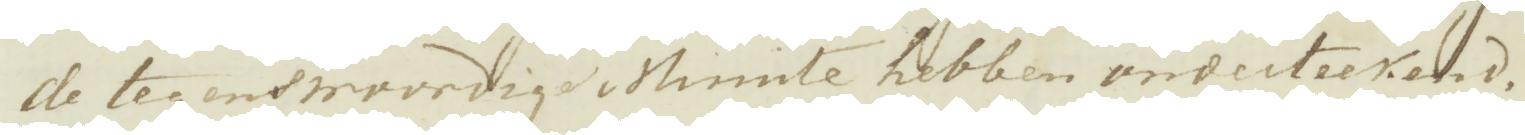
de tegenswoordige Minute hebben onderteekend,
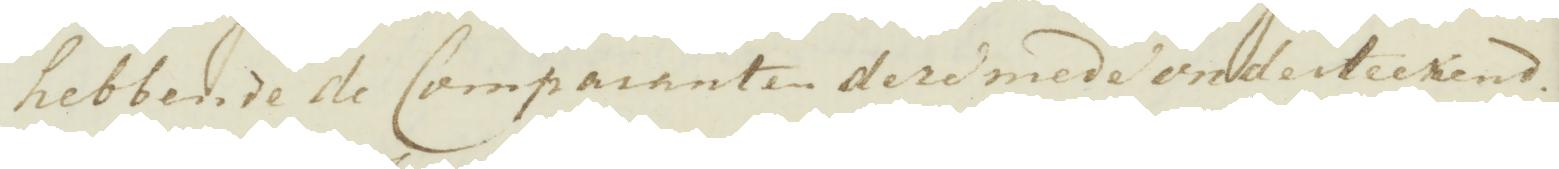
hebbende de Comparanten deze mede onderteekend.
